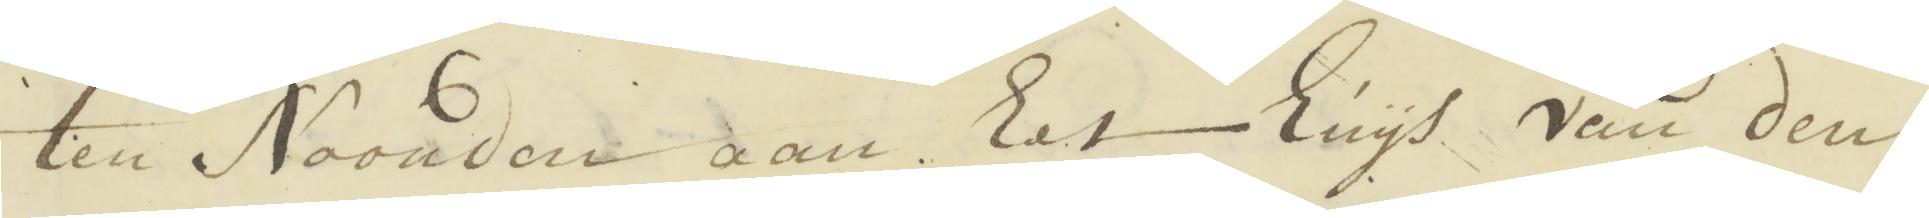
ten Noorden aan het huijs van den
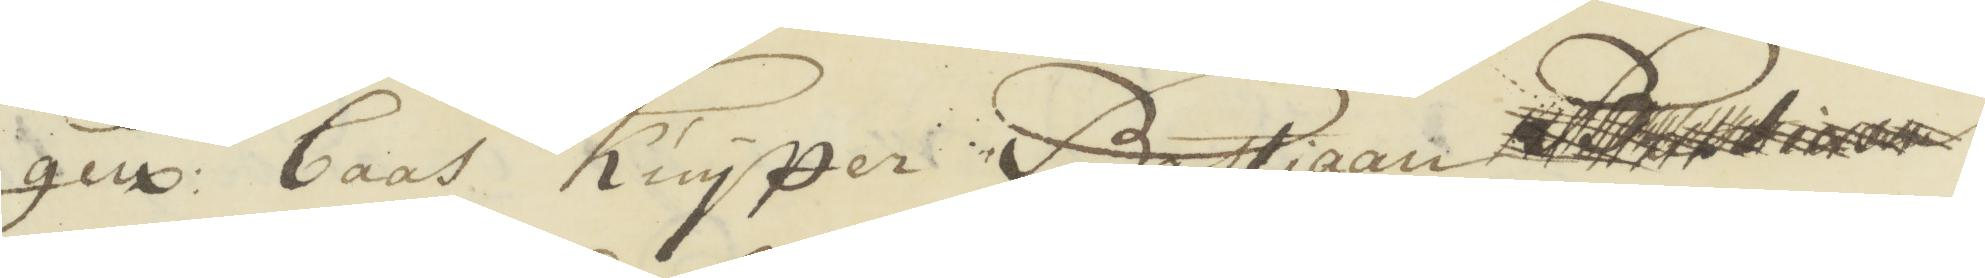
gew: baas Kuijper Bastiaan Bastiaan
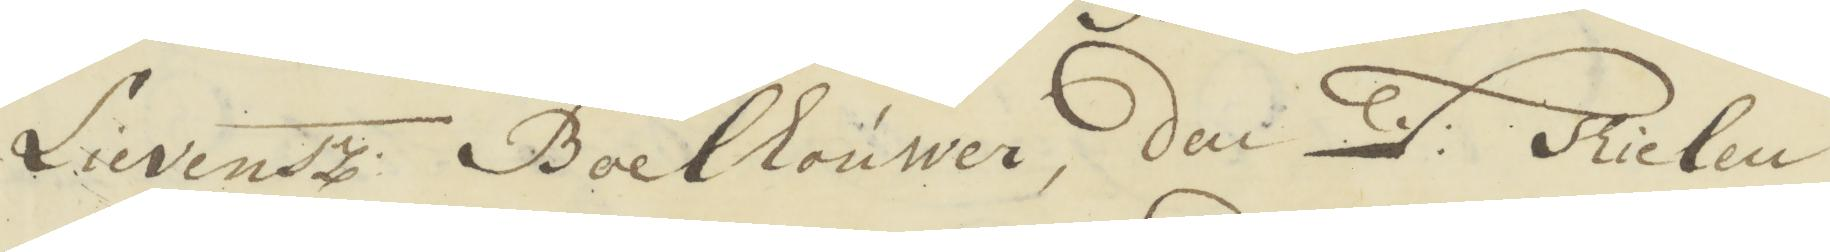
Lievensz: Boelhouwer, den E: Thielen
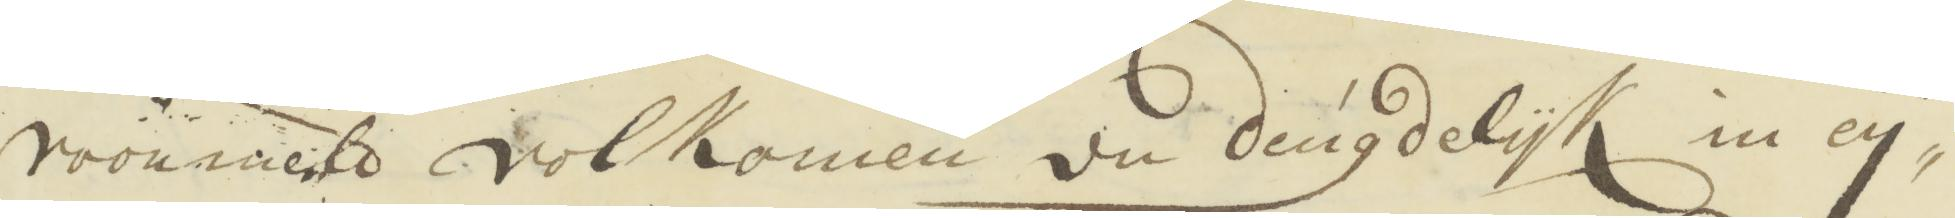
voormeld volkomen en deugdelijk in eij„
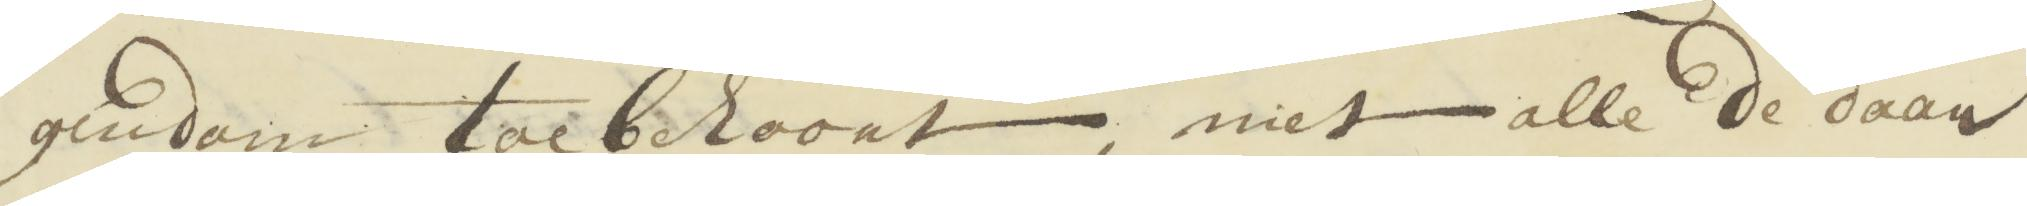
gendom: toebehoort; met alle de daar
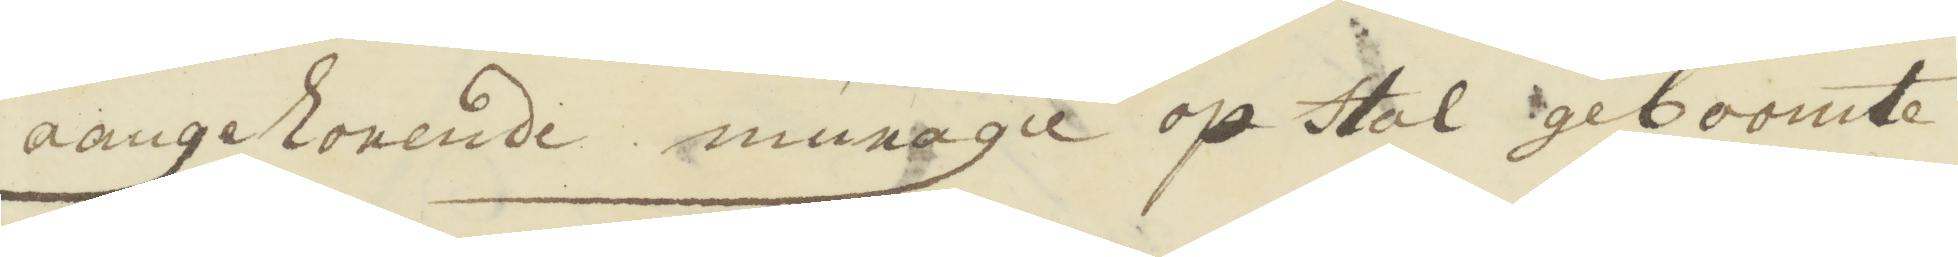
aangehorende muragie opstal geboomte
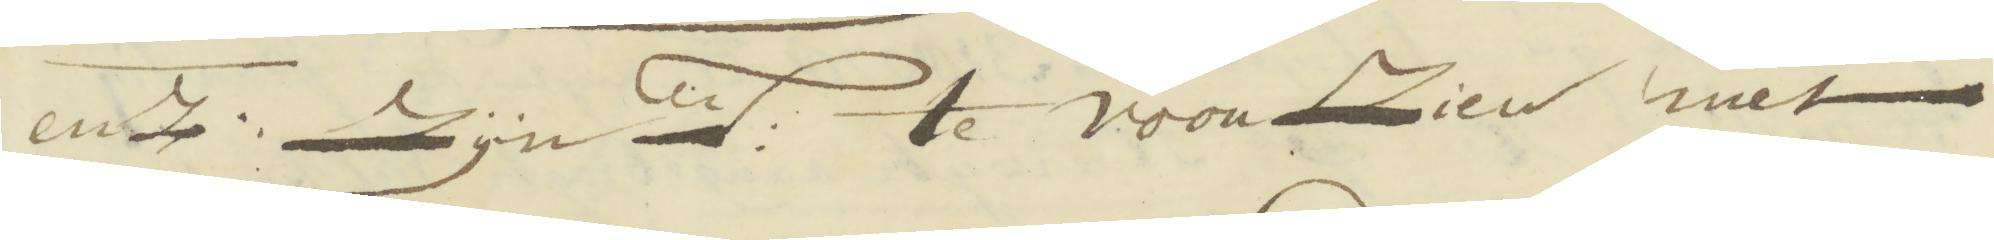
enz: Zijn E: te voorzien met
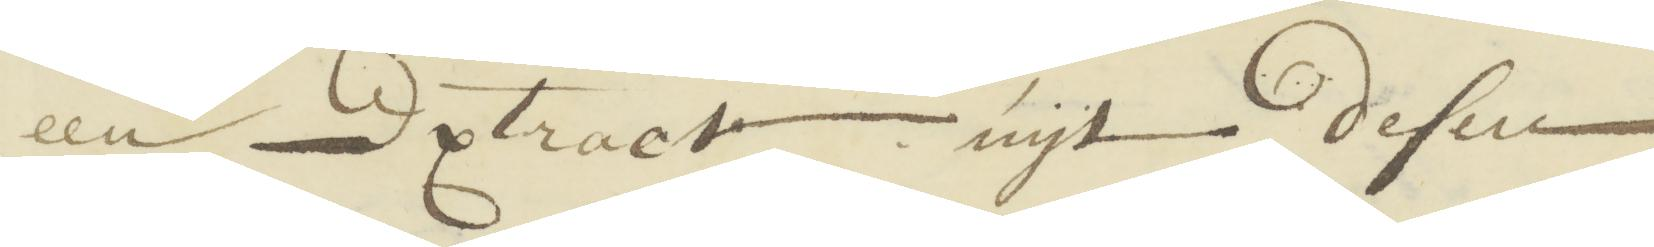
een Extract uijt desen
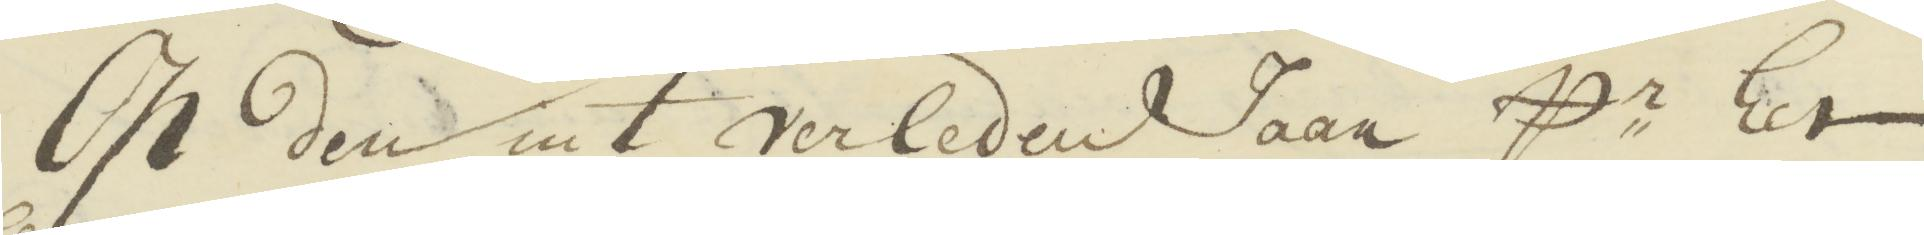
Op den in't verleden Iaar p„r het
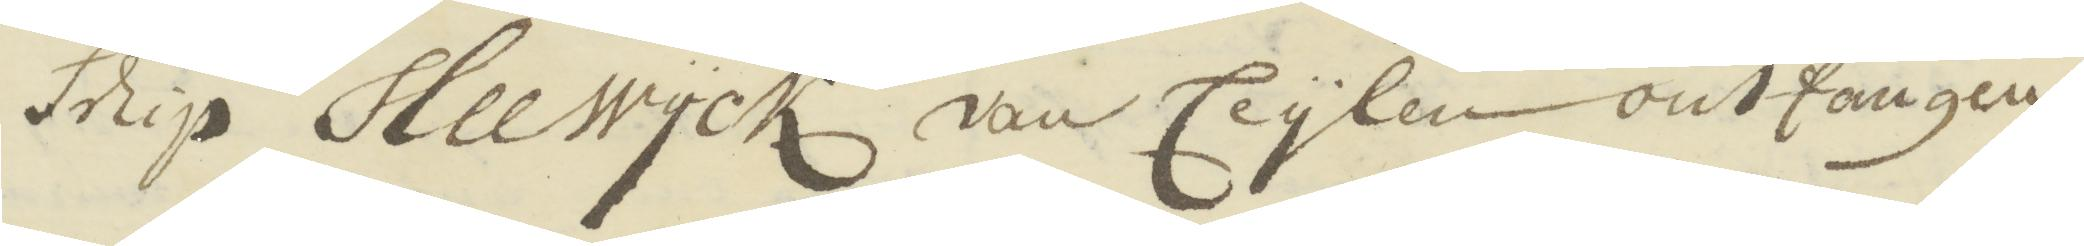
schip Sleewijck van Ceijlon ontfangen
